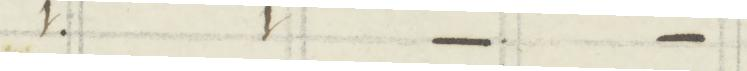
1. 1 —. —
